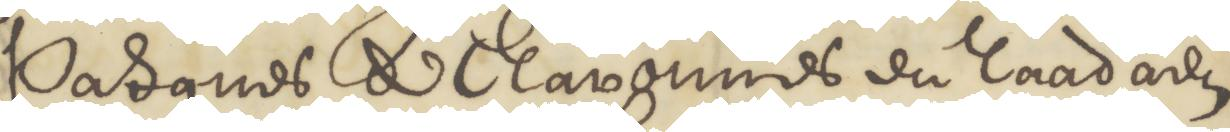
Pasques de Chavonnes en Raad aen
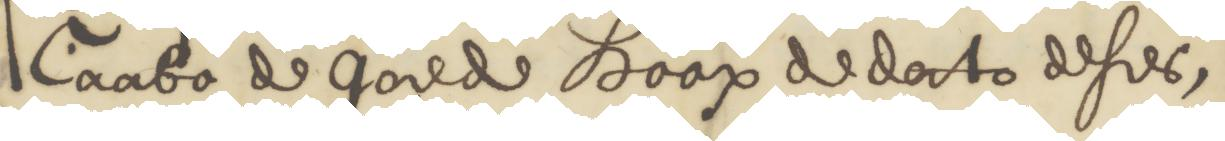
Caabo de goede Hoop de dato deses,
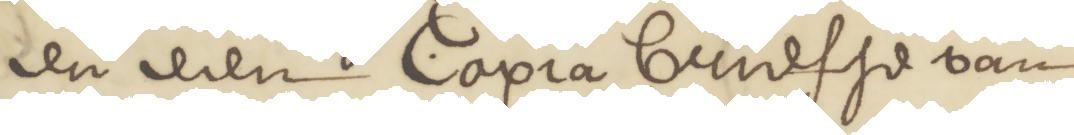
en een Copia briefje van
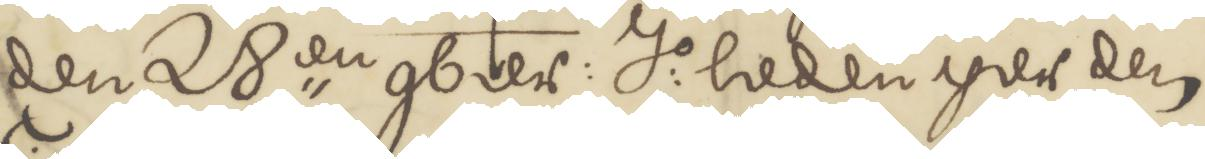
den 28„en 9ber: J:o heden per den
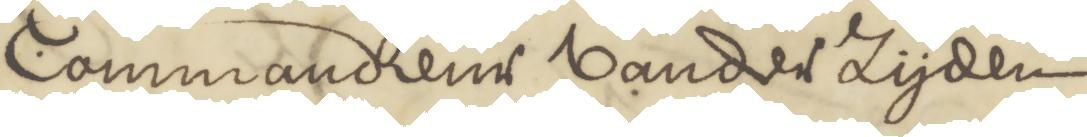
Commandeur vander zijden.
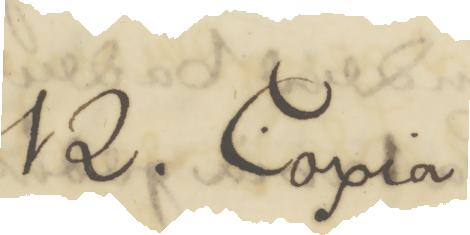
12. Copia
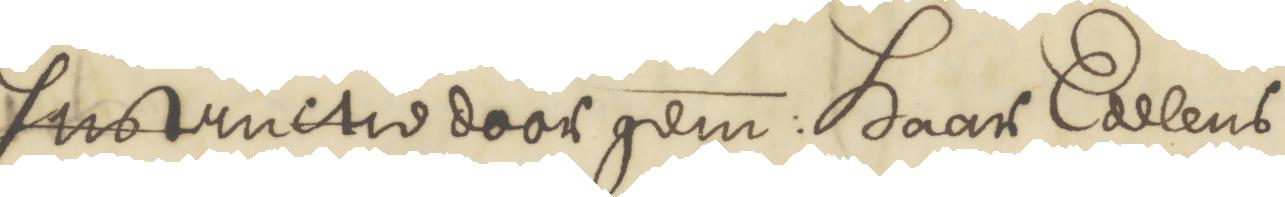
Instructie door gem: Haar Edelens
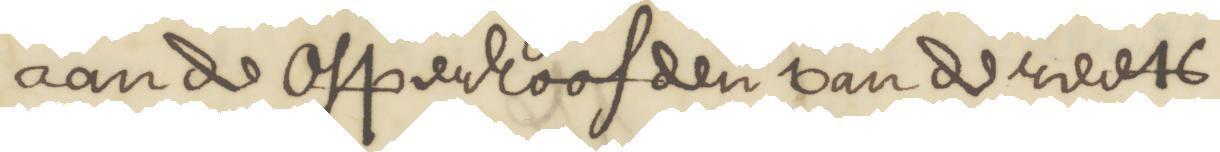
aan de opperhoof den van de reets
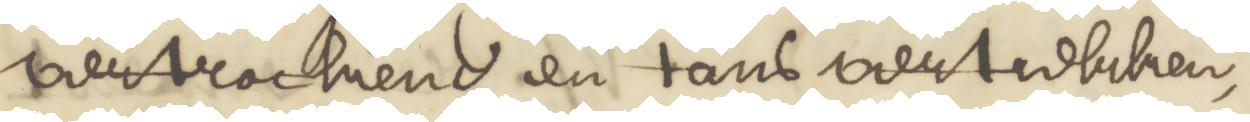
vertrockene en tans vertrekken,
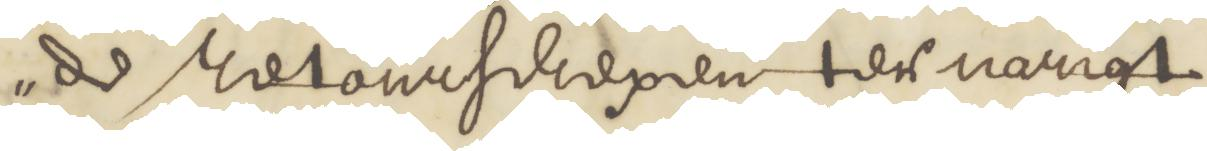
„ de retourscheepen ter narigt
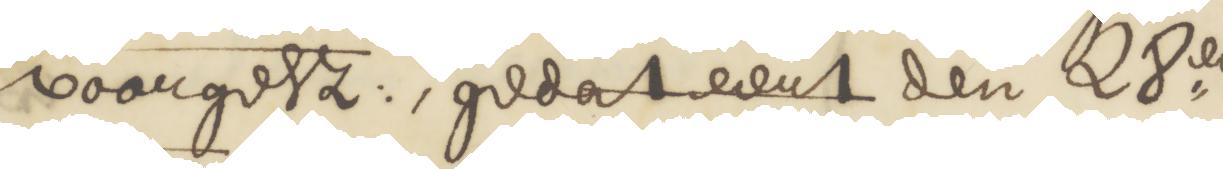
voorgesz:, gedateert den 28„en
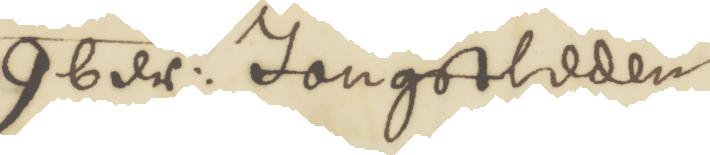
9ber: Jongstleden
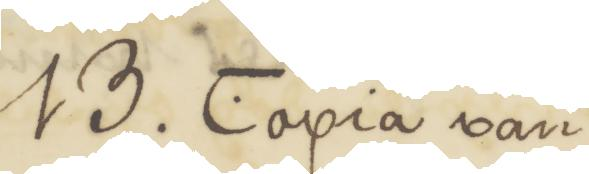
13. Copia van
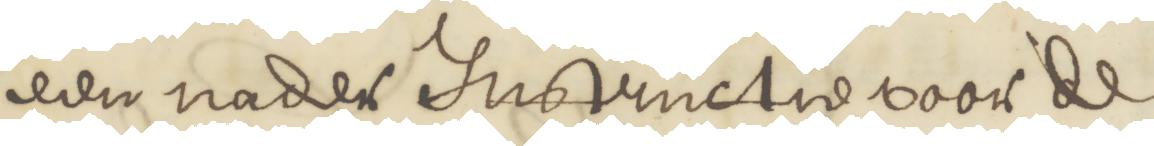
een nader Instructie voor de
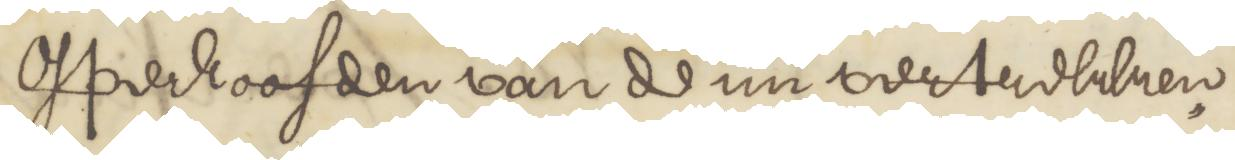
Opperhoofden van de nu vertrekken„
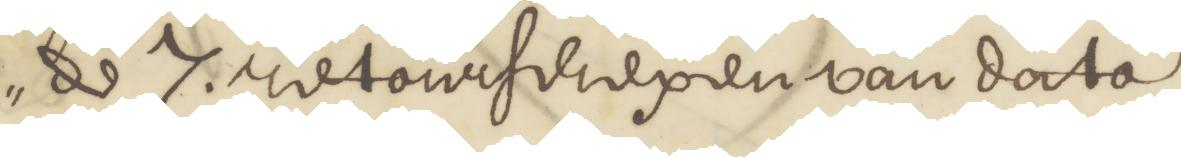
„ de 7. retourscheepen van dato
